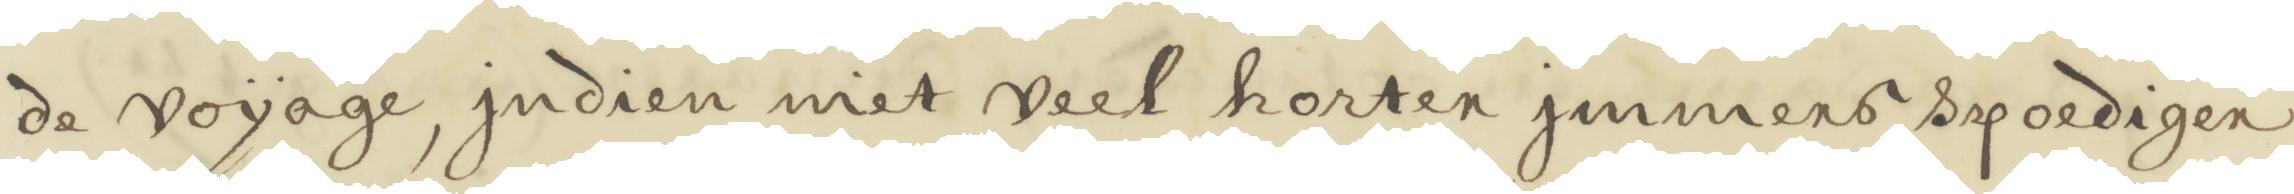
de voijage, jndien niet veel korter jmmers, spoediger
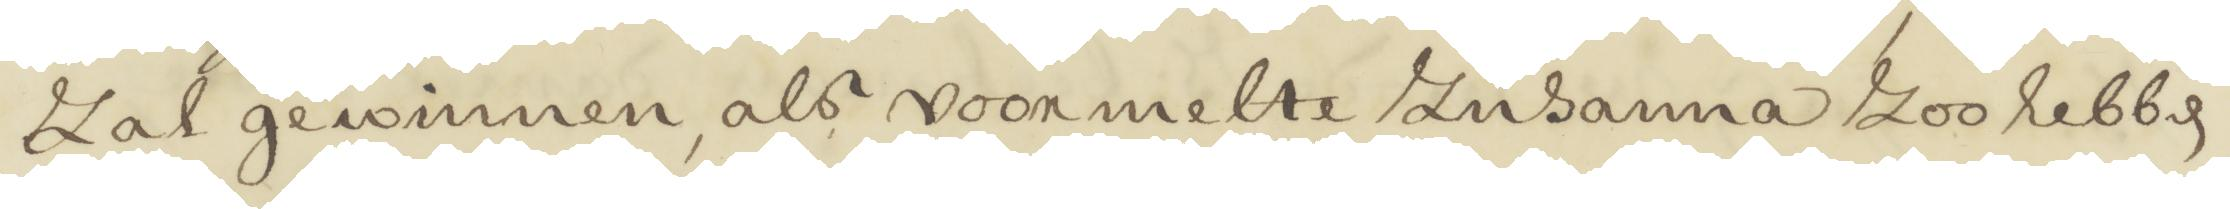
zal gewinnen, als voormelte zusanna zoo hebben
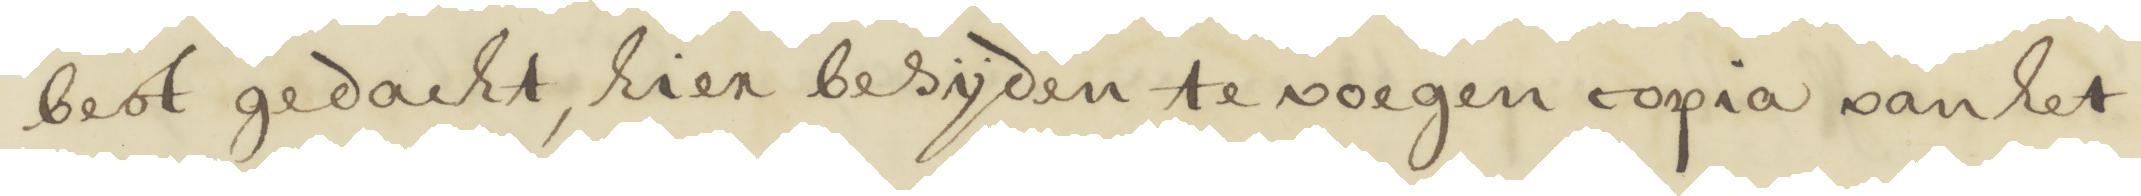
best gedacht, hier besijden te voegen copia van het
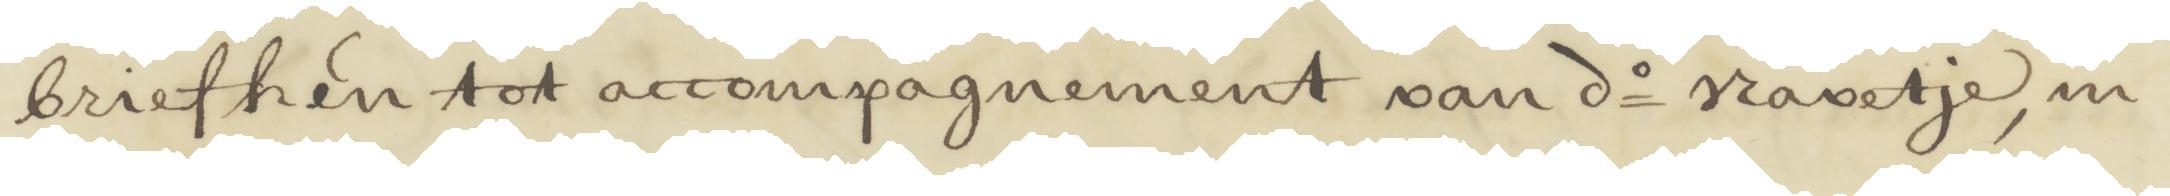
briefken tot accompagnement van d=o Navetje, in
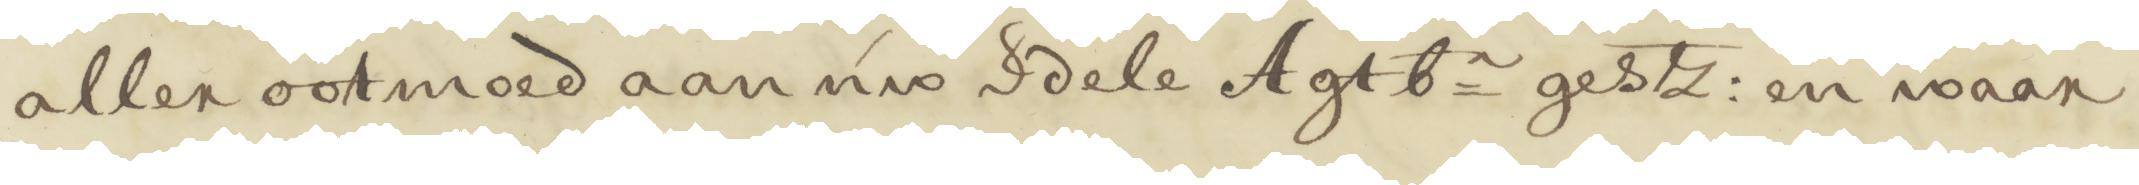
aller ootmoed aan uw Edele Agtb=r gesz: en waar
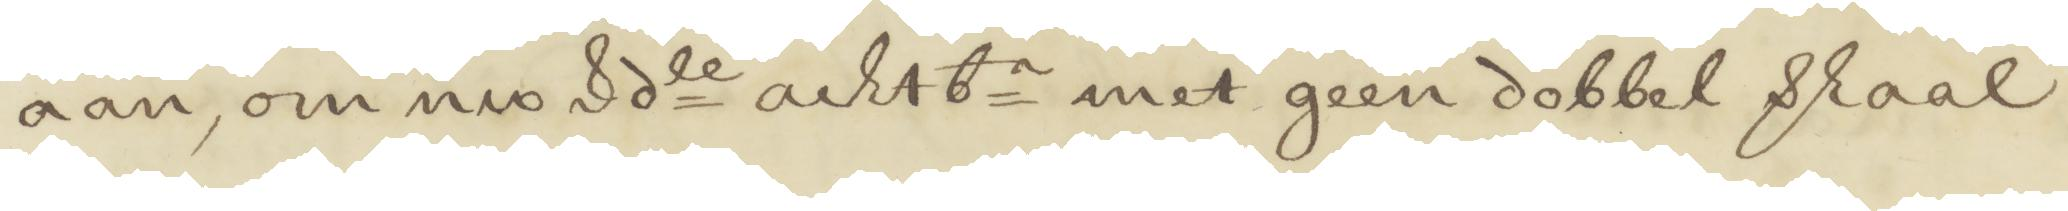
aan, om uw Ed=le achtb=r met geen dobbel verhaal
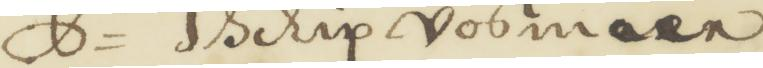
P=r t schip vosmaer
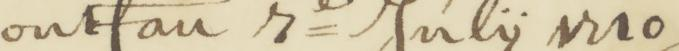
ontfan 7=e Julij 1710
